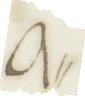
4„
